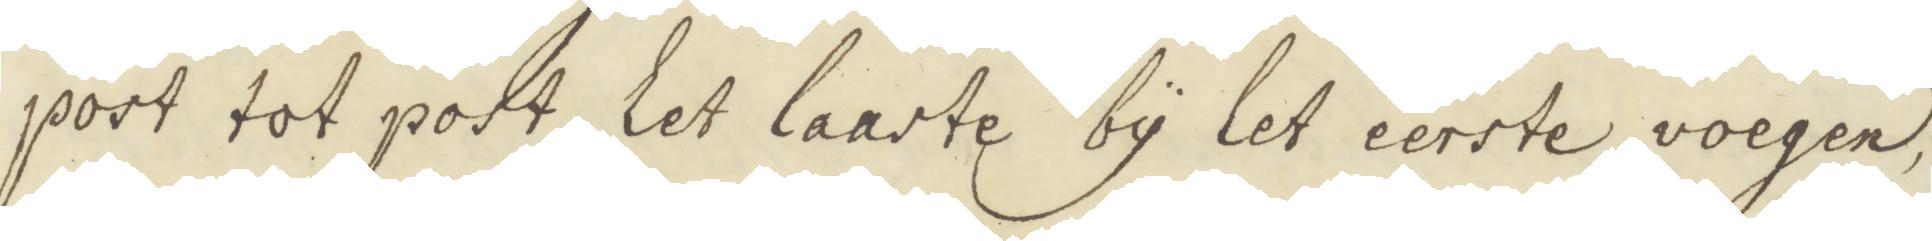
post tot post het laaste bij het eerste voegen,
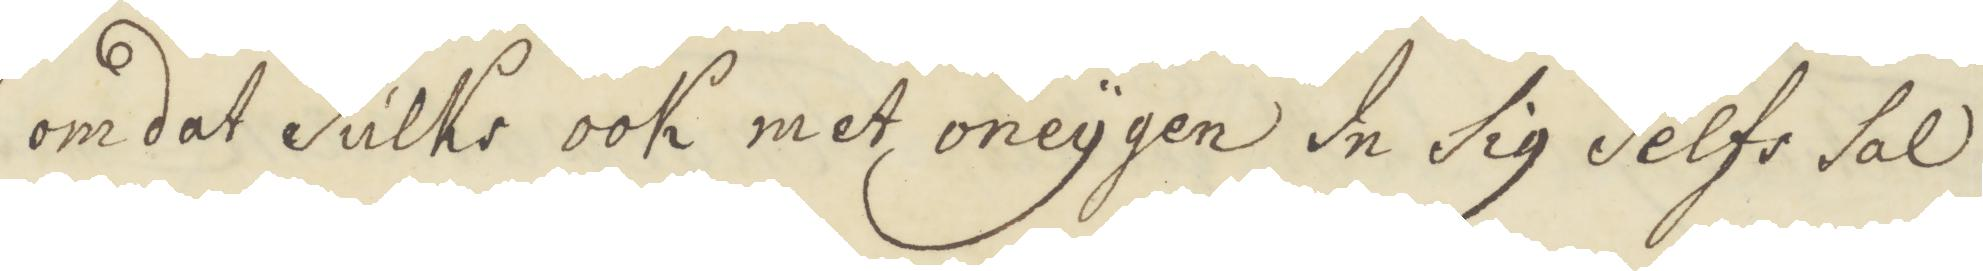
om dat sulks ook met oneijgen In sig selfs sal
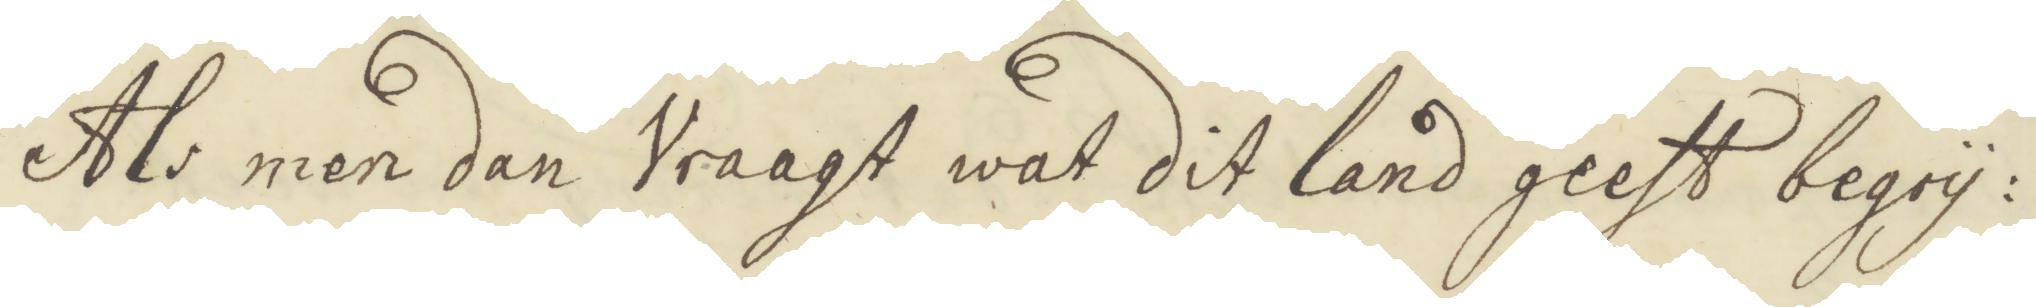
Als men dan Vraagt wat dit land geeft begrij:
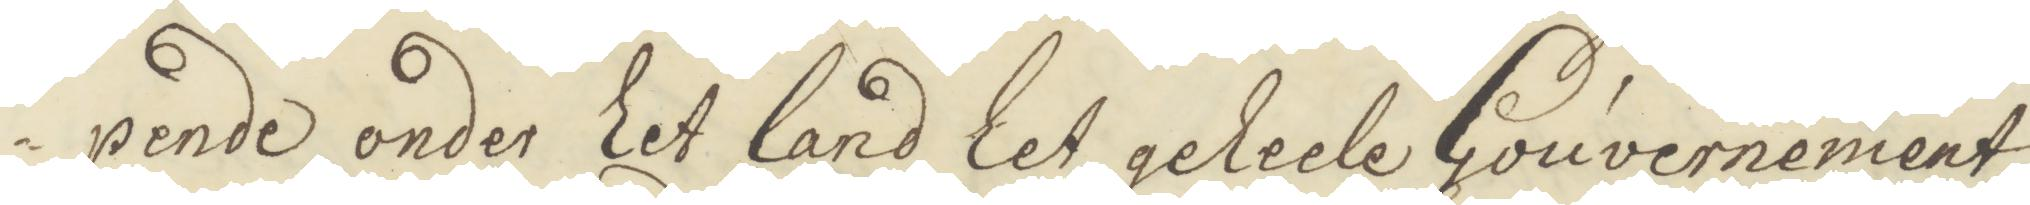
„pende onder het land het geheele Gouvernement
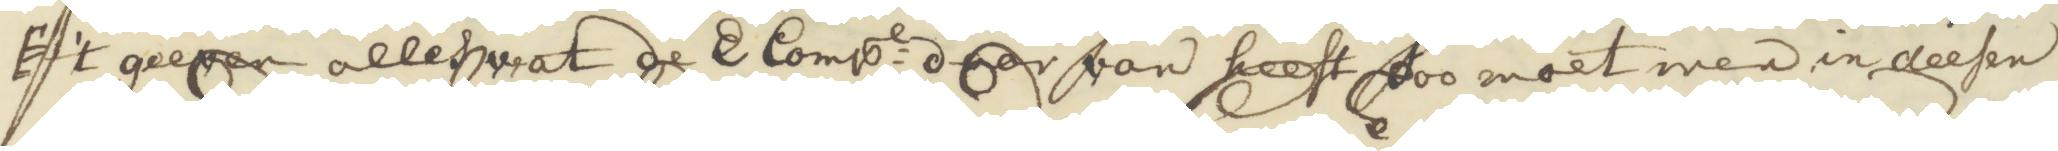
[ ’t geeven alles wat de E Comp:e daar van heeft, soo moet men in deesen
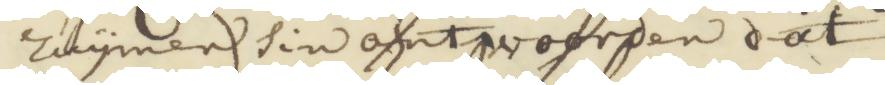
ruijmen sin antwoorden dat
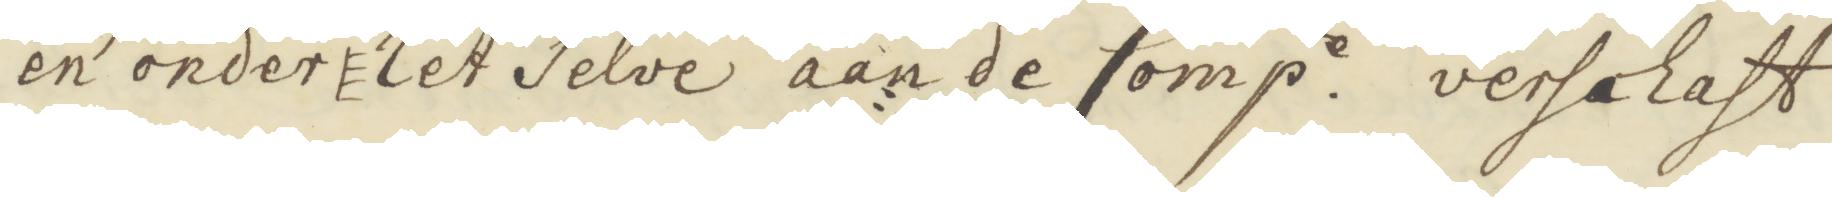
en onder [ het selve aan de Comp.e verschaft
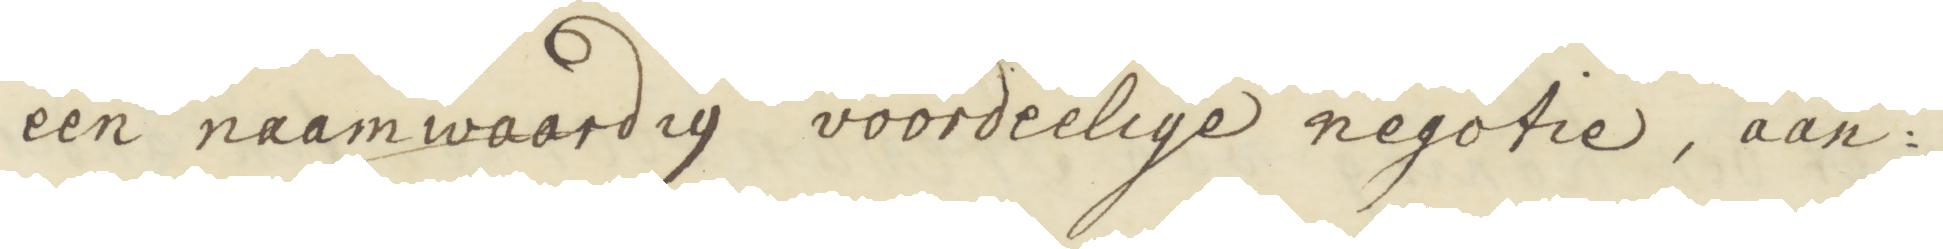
een naam waardig voordeelige negotie, aan:
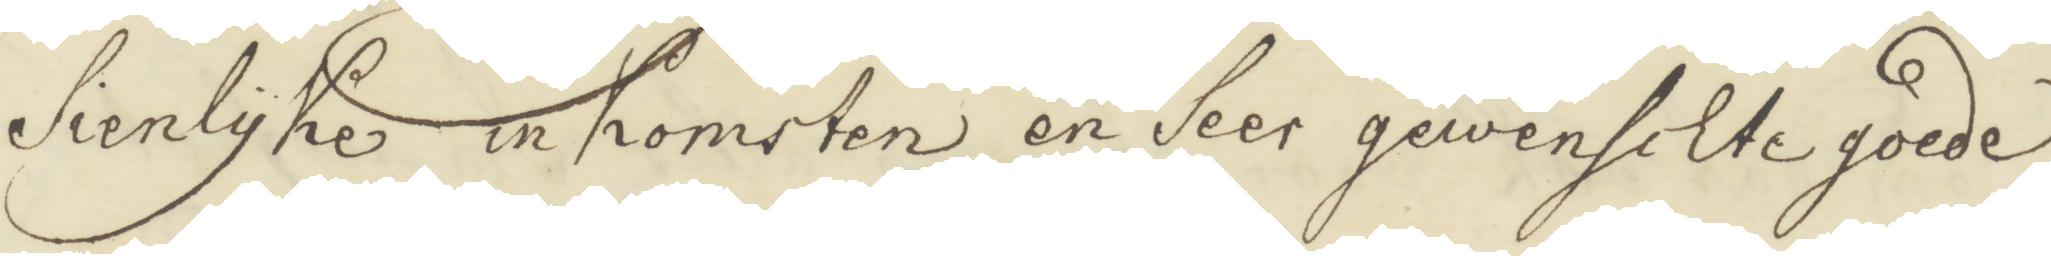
sienlijke in komsten en seer gewenschte goede
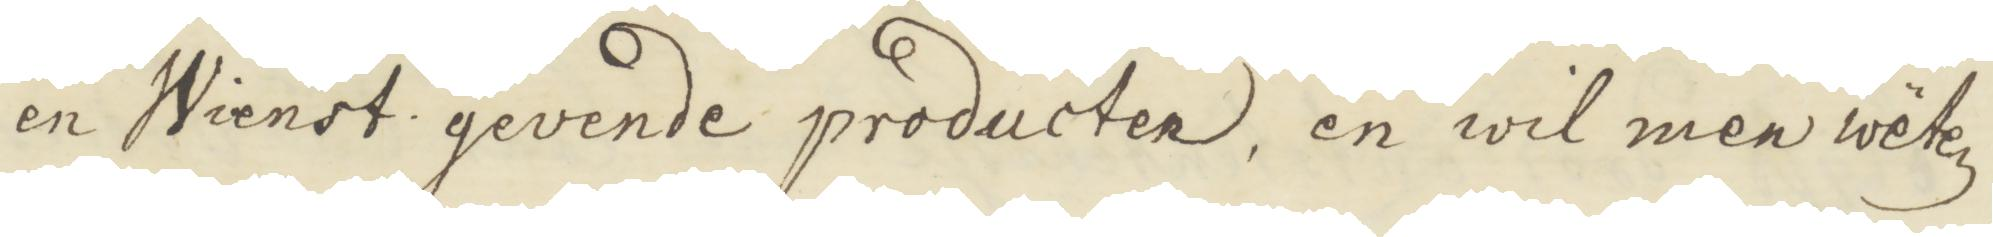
en Wienst . gevende producten, en wil men weten
